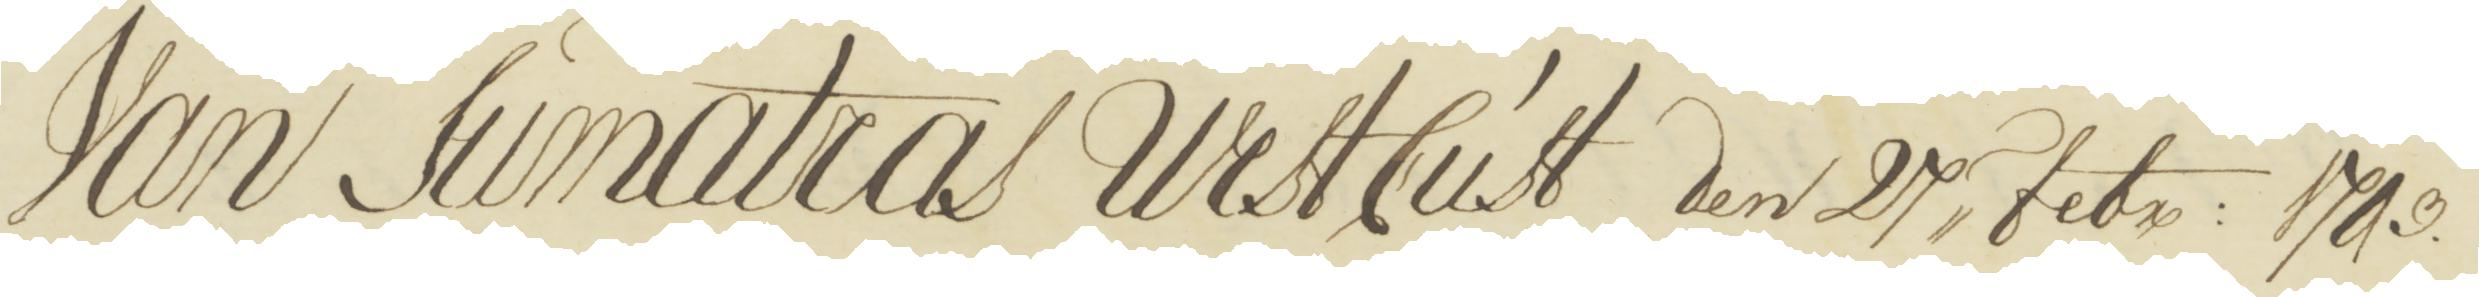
Van Sumatras WestCust den 27„' Febr: 1743.
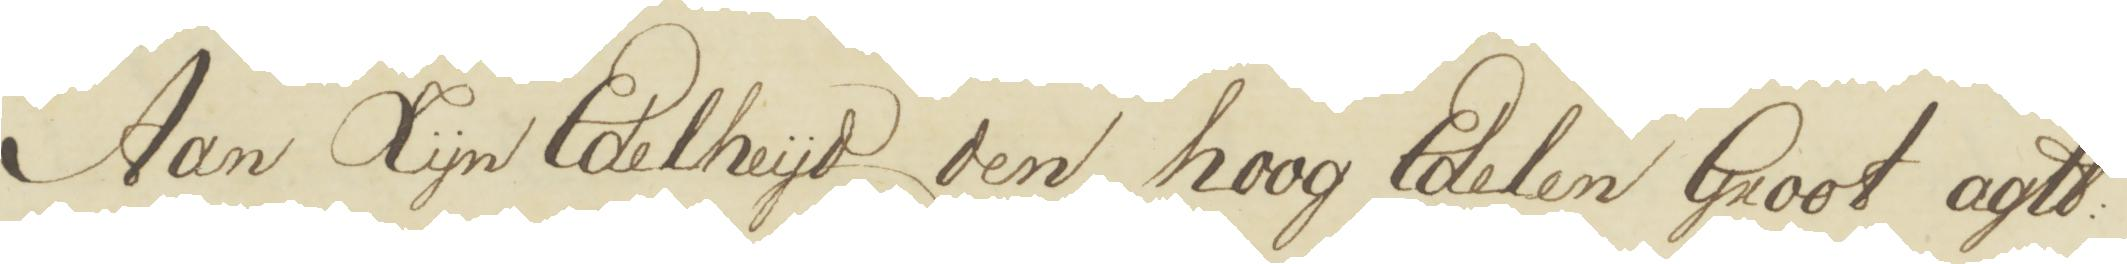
Aan Zijn Edelheijd den hoog Edelen Groot agtb:re
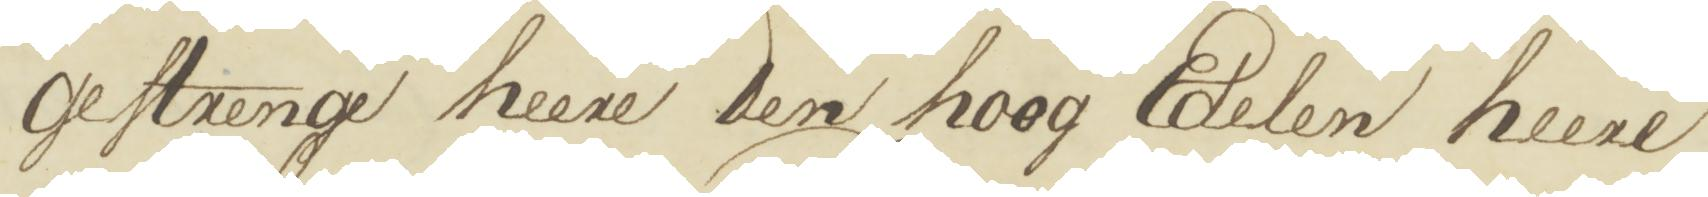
gestrenge heere den hoog Edelen Heere
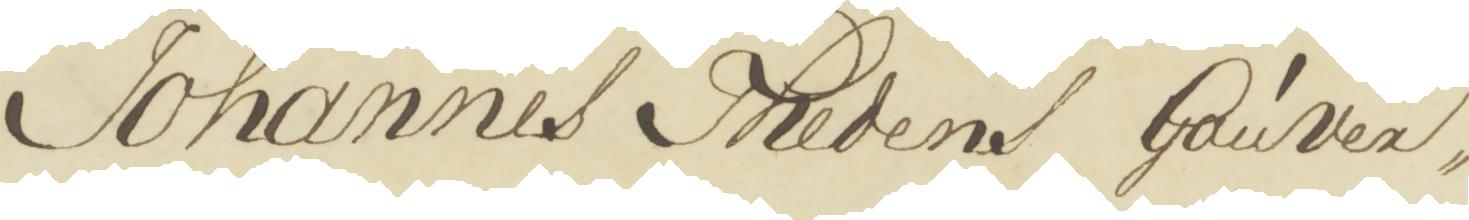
Johannes Thedens Gouver„
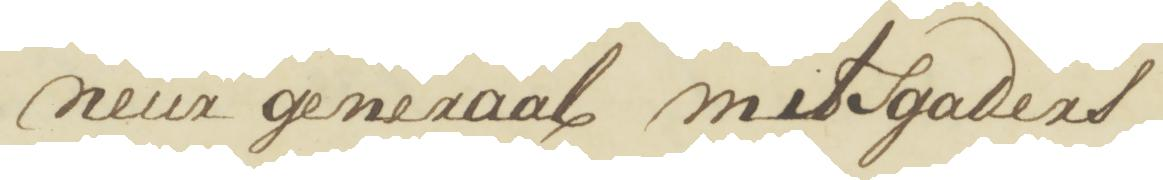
neur generaal mitsgaders
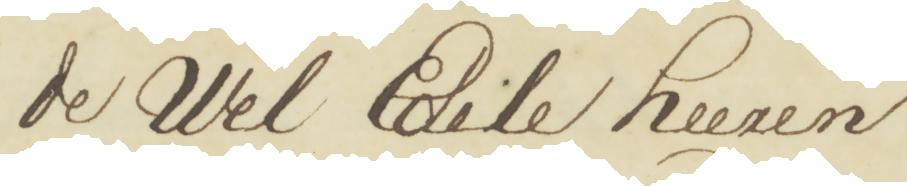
de Wel Edele heeren
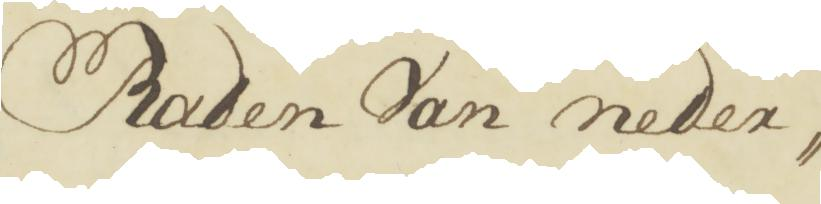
Raden van neder„
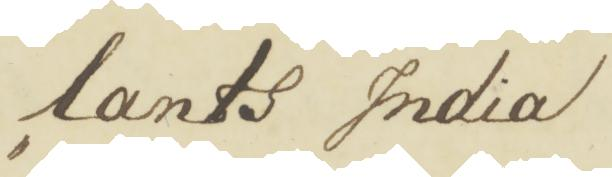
„lants Jndia
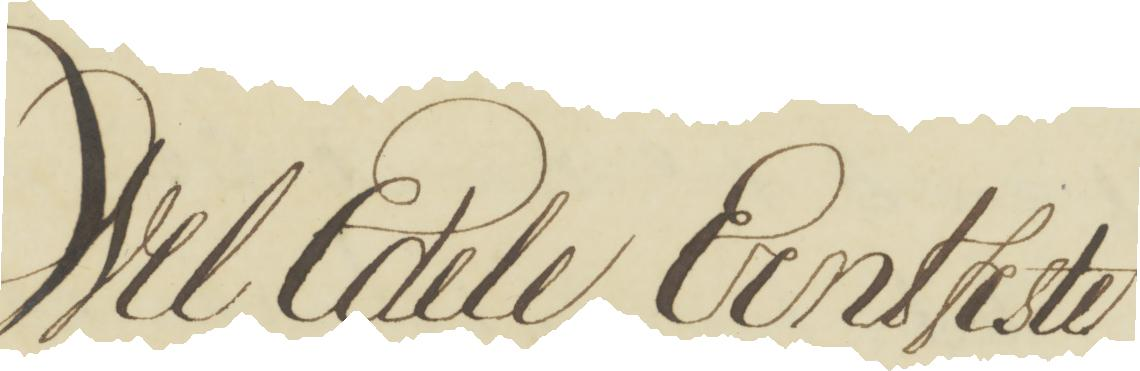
Wel Edele Erntfeste
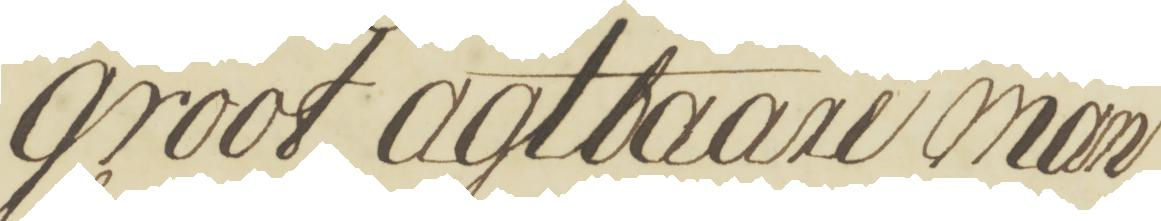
groot agtbaare man
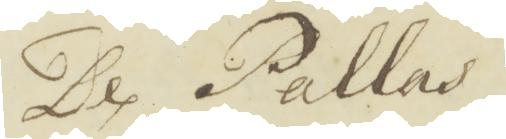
De Pallas
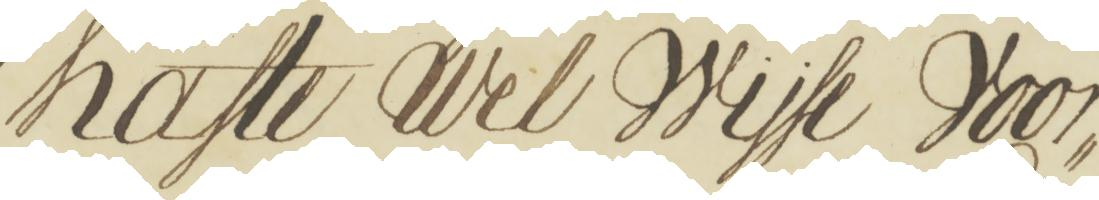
hafte wel Wijse Voor„
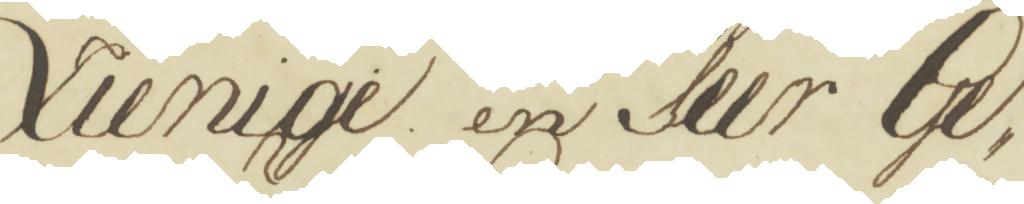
zienige en seer Ge„
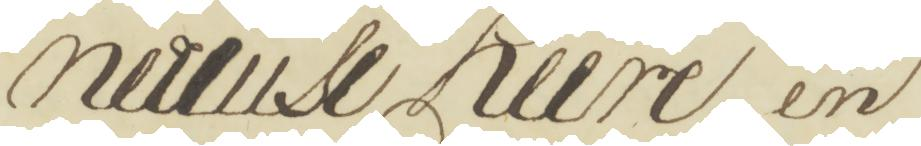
nereuse heere en
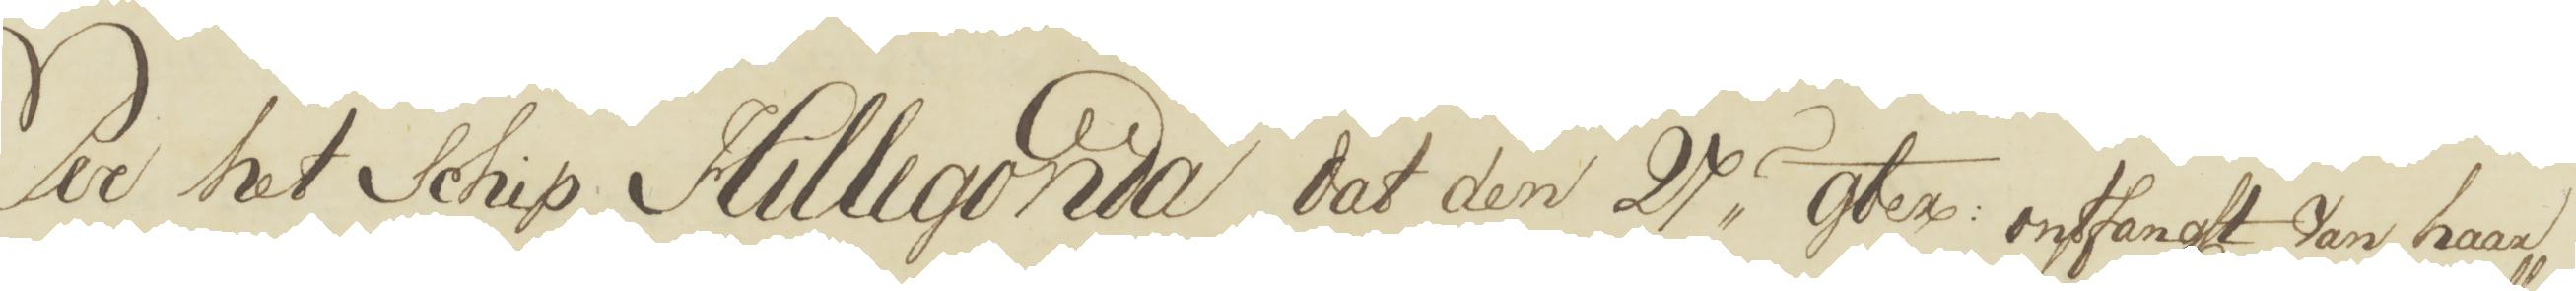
Per het schip Hillegonda dat den 27„' 9ber: ontfangt van haar
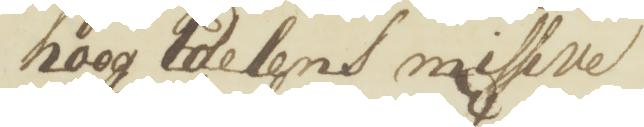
hoog Edelens missive
